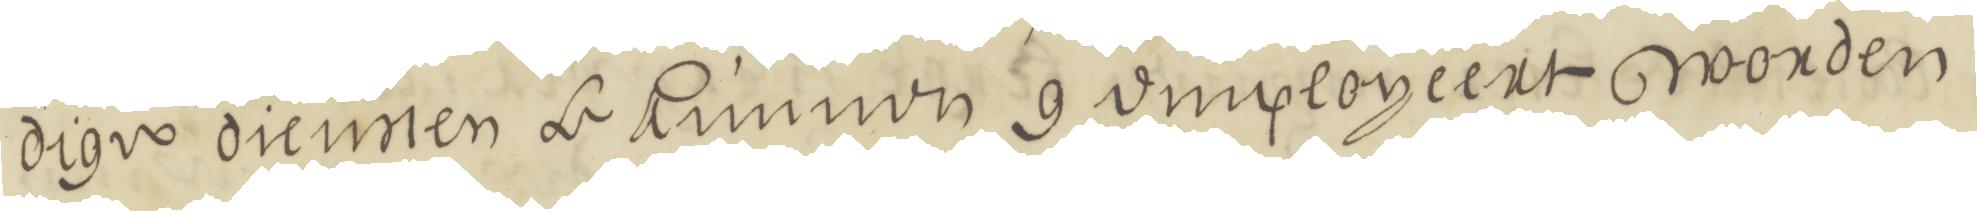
dige diennen te kunnen g emploijeert worden
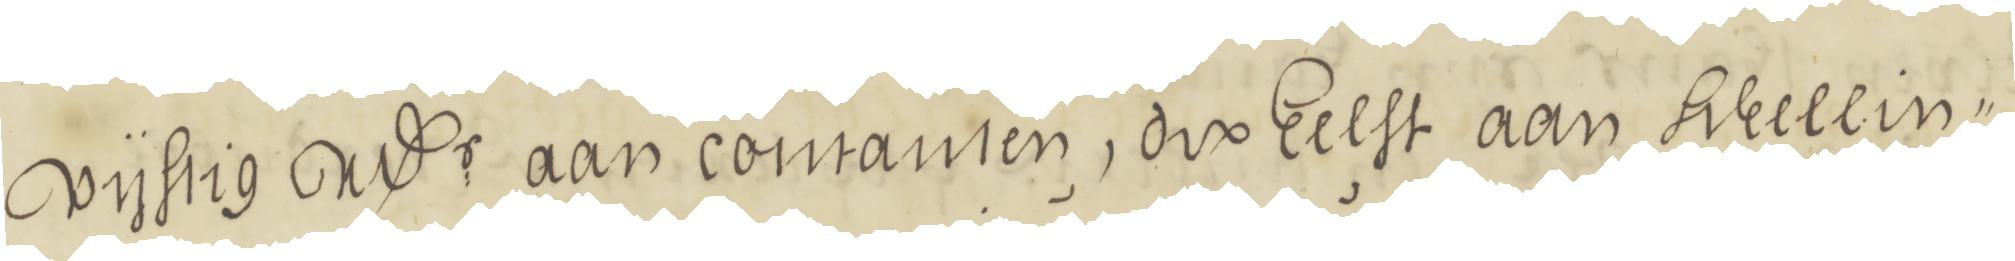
vijftig rx:s aan contanten, de helft aan schellin„
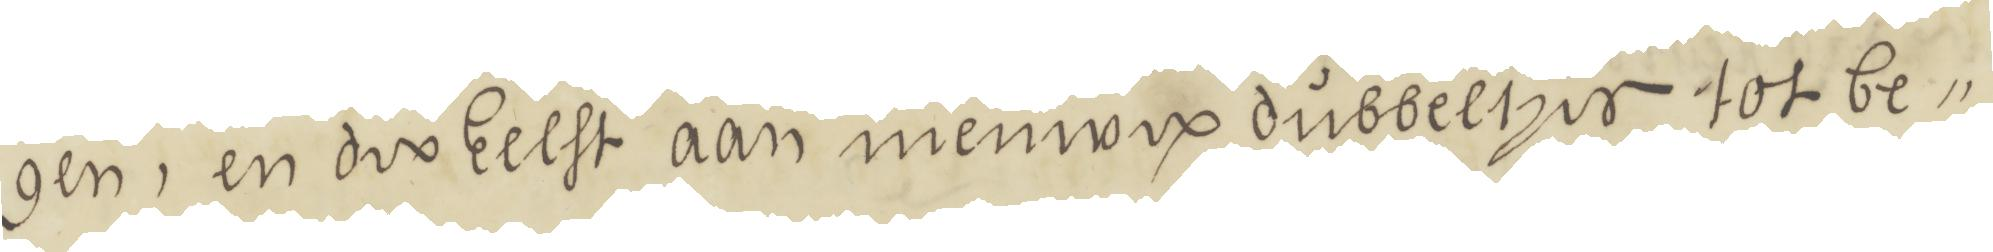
gen, en de helft aan nieuwe dubbeltjis tot be„
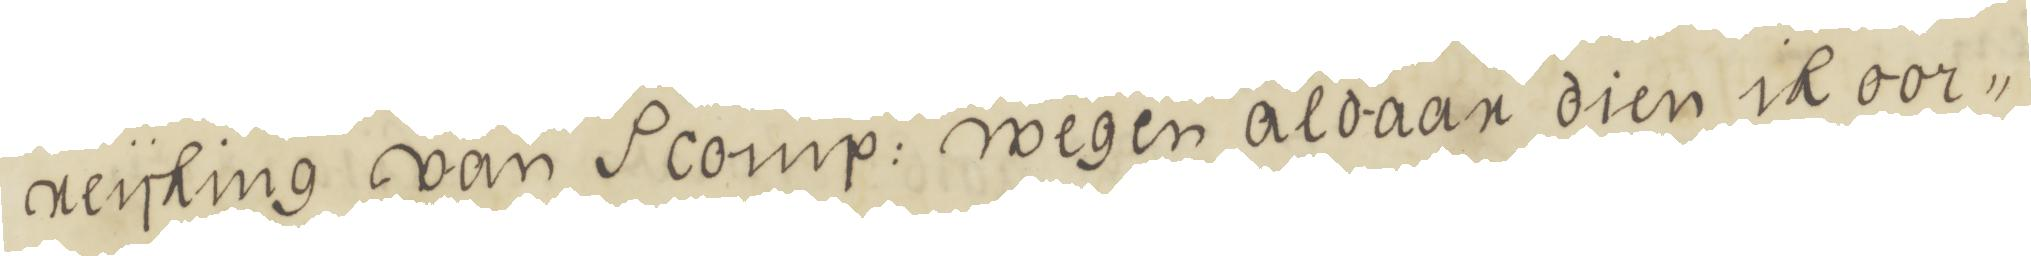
reijking van s comp: wegen aldaar dien ik oor„
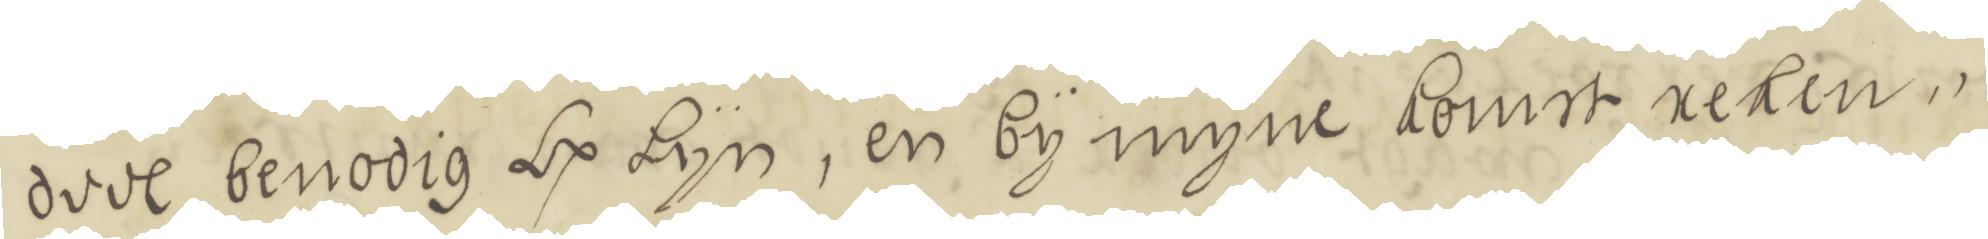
deel benodig te sijn, en bij mijne komst reken„
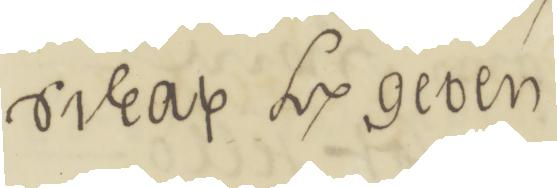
schap te geven
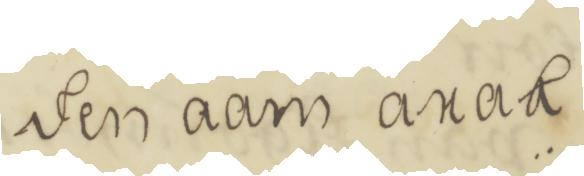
Een aam arak
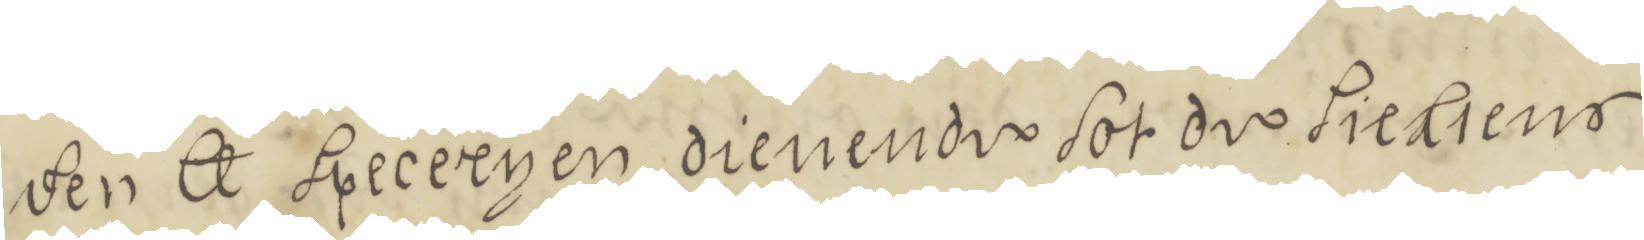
Een lb specerijen dienende tot de siektens
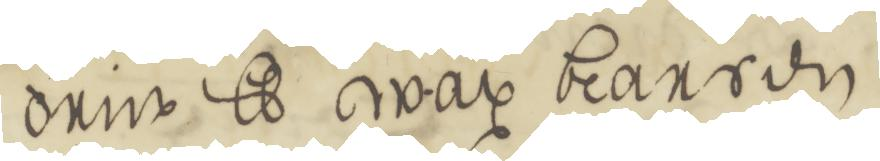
drie lb wax karsen
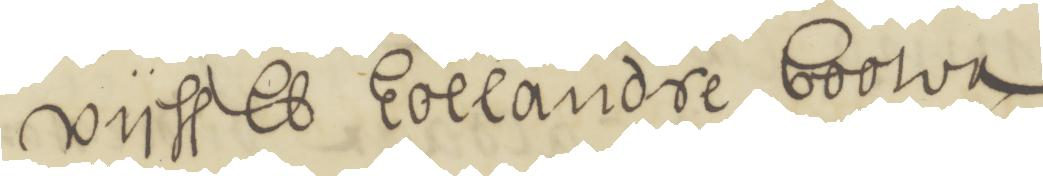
vijff lb hollandse booter
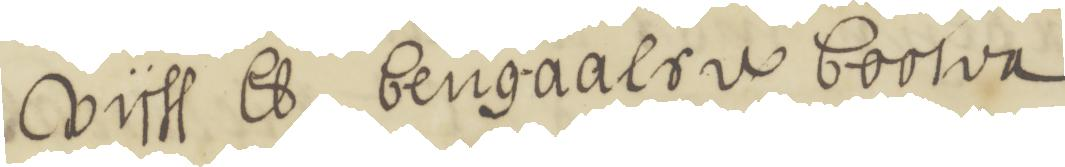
vijff lb bengaalse booter
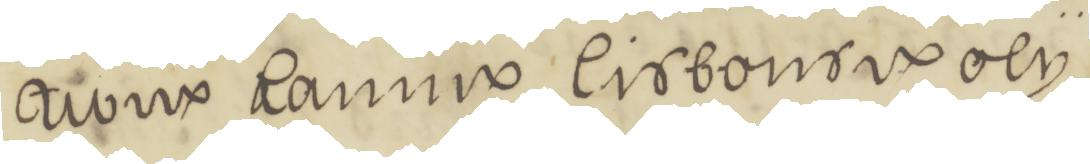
twee kanne lisbonse olij
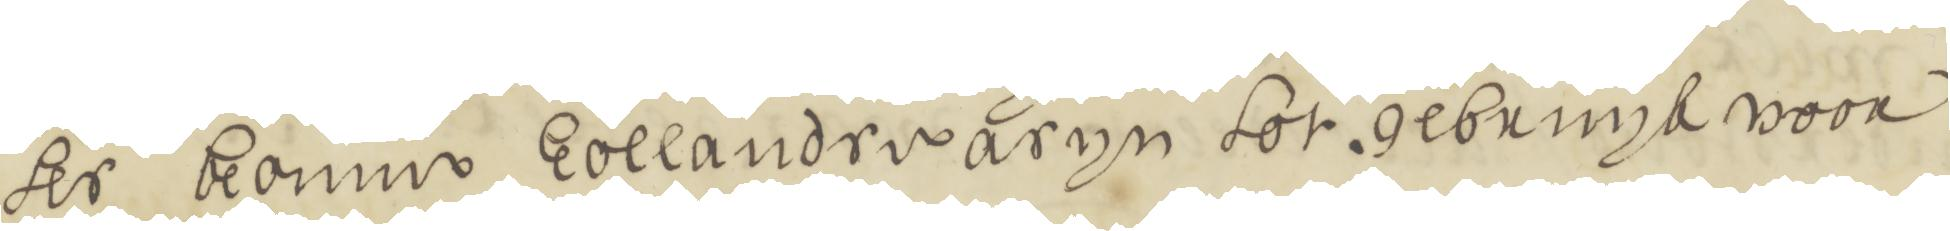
ses kanne hollandse asijn tot gebruijk voor
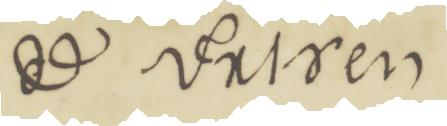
de Ertsen
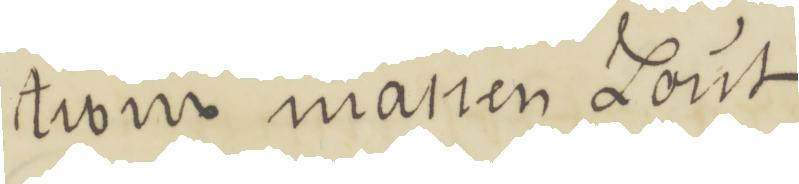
twee matten Zout
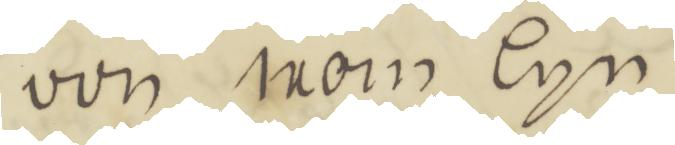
een trom lijn
